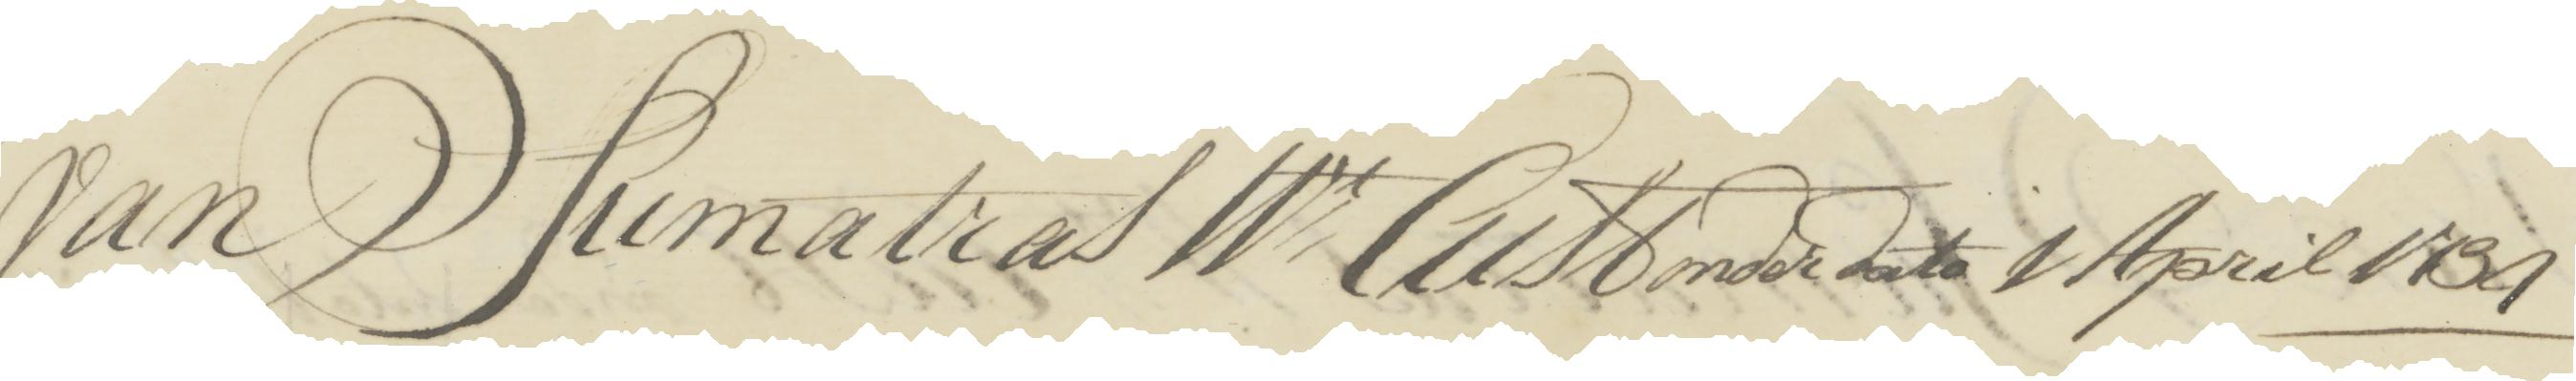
Van Sumatras W„t Cust onder dato 1 April 1734
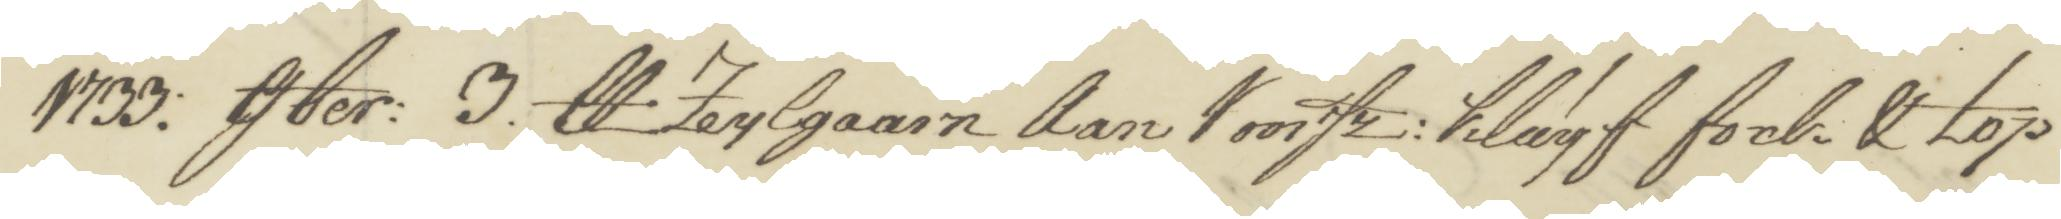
1733: 9ber: 3: lb Zeylgaarn Aan Voorsz: kluyf fock & top
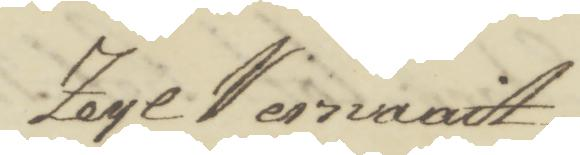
Zeyl Verwaait
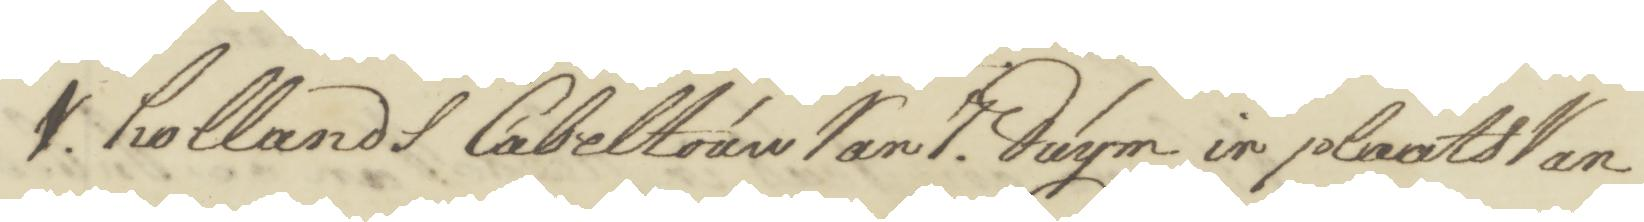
1. hollands Cabeltouw van 7. duyn in plaats Van
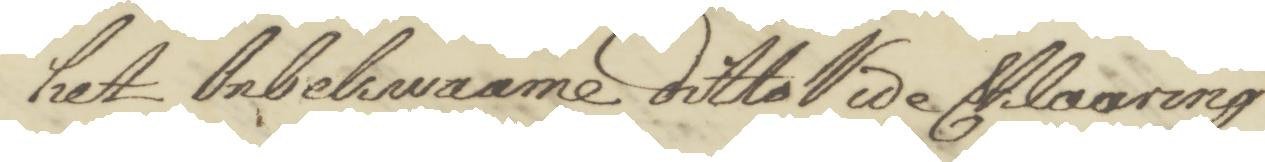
het Onbekwaame ditto Vide verklaaring
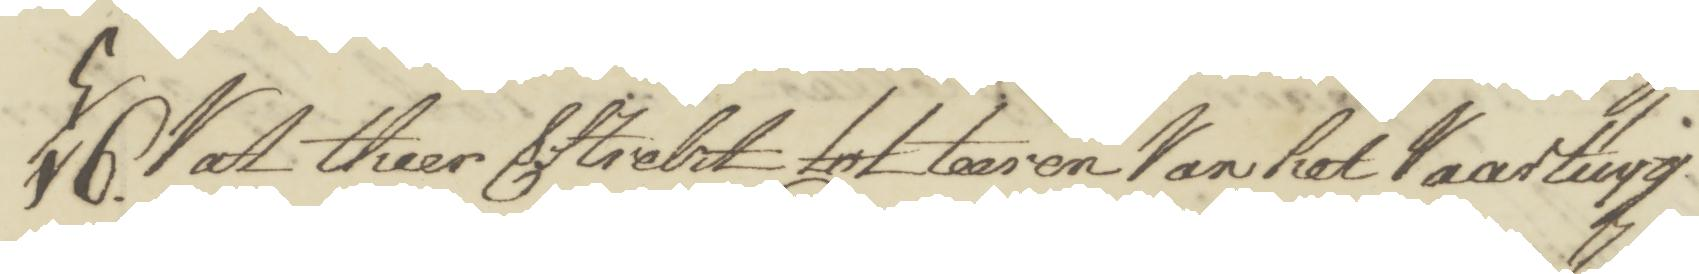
5/16. Vat theer verstrekt tot teeren Van het Vaartuyg
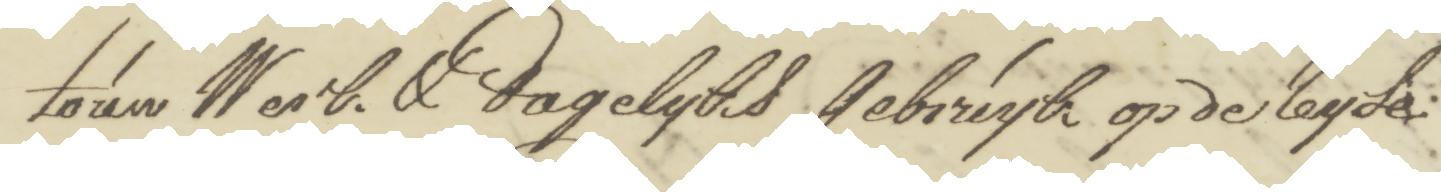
touw Werk & dagelijks Gebruijk op de Reyse:
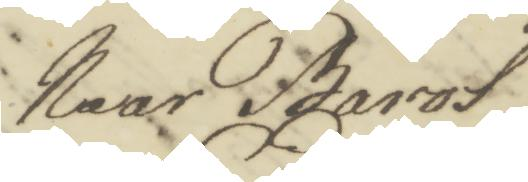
Naar Baros
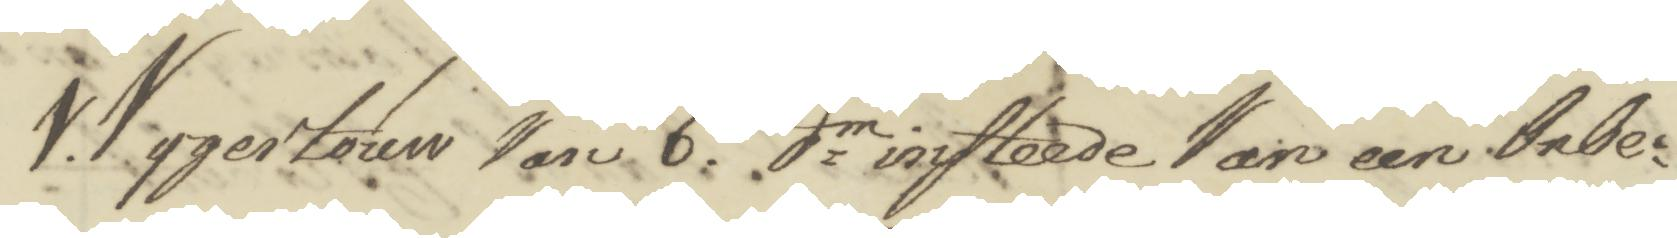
1. Vygertouw van 6: d=m insteede van een Onbe:
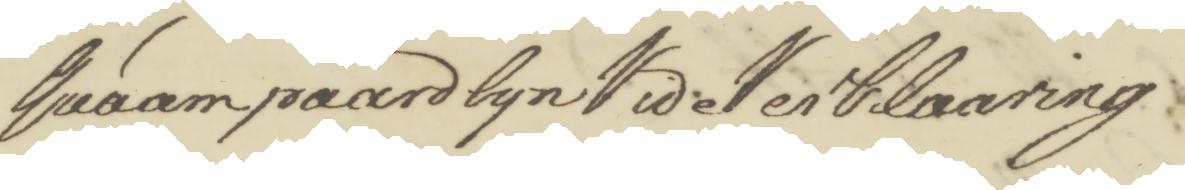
quaam paard lyn Vide Verklaaring
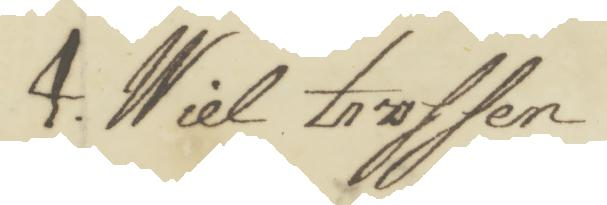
4. Wiel trossen
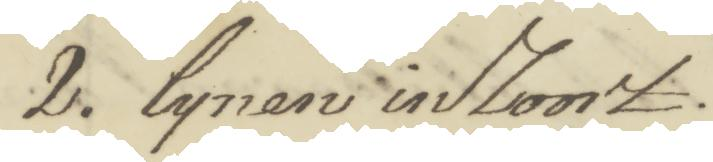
2. lynen in zoort
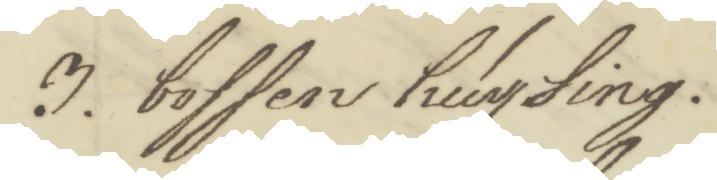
3. bossen huysing.
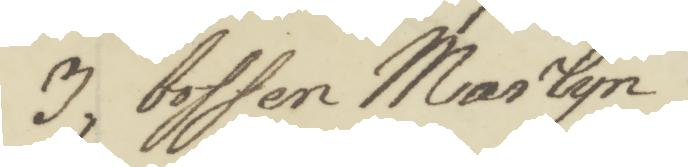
3. bossen Marlyn
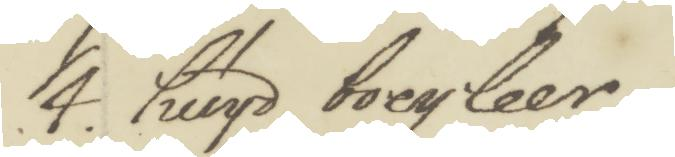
¼. huyd boeyleer.
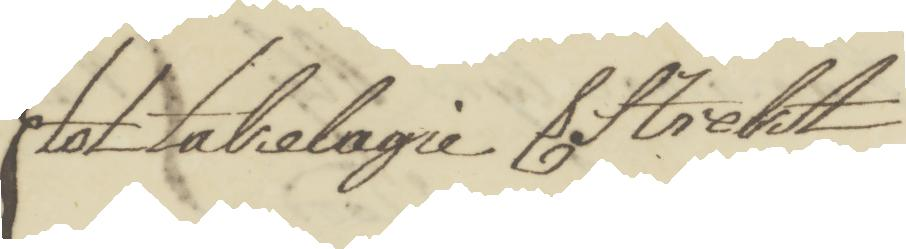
tot takelagie verstrekt.
